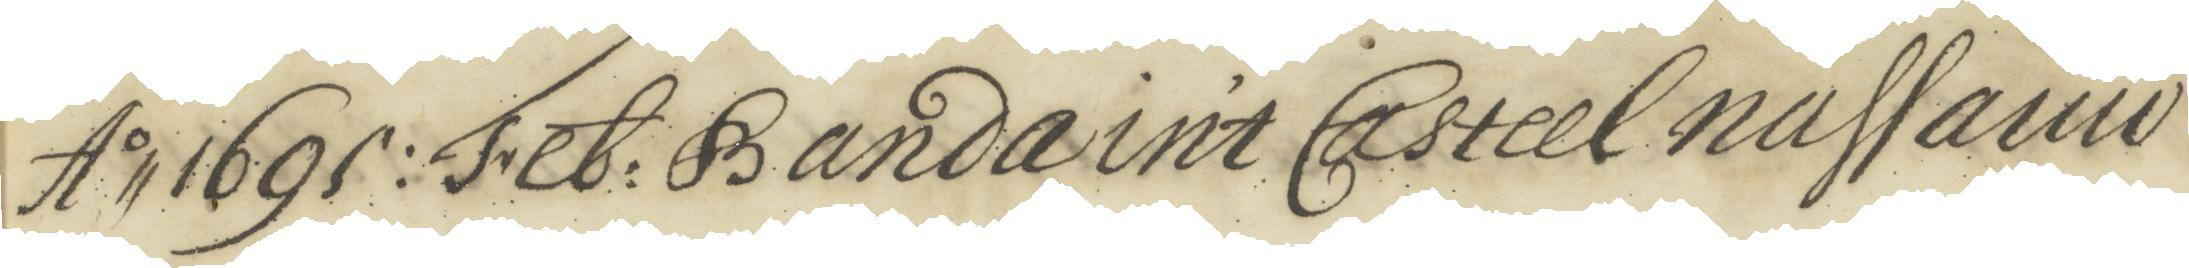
A„o 1695: Feb: Banda in’t Casteel nassauw
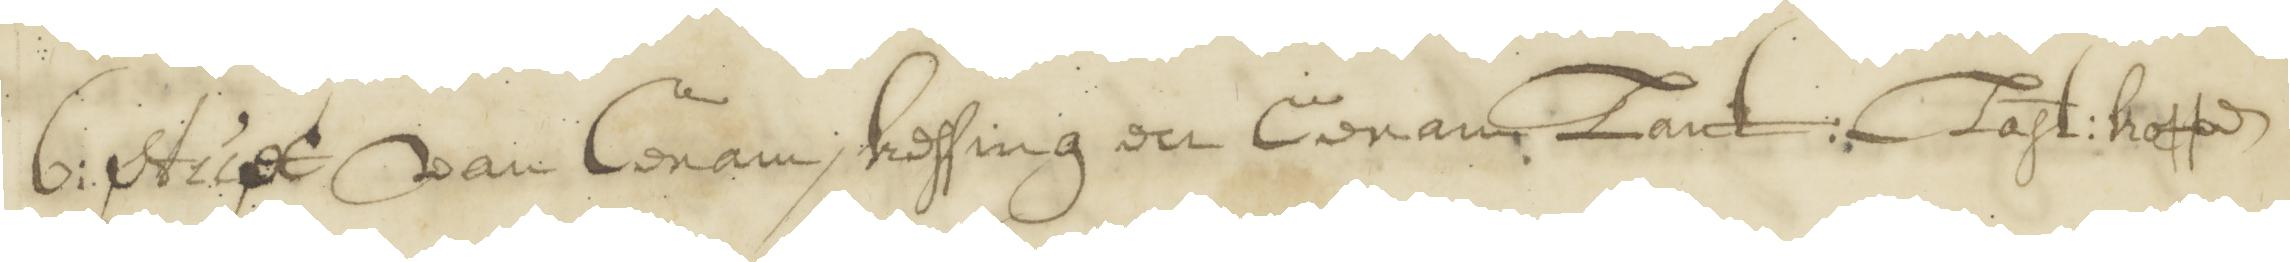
6: stux van Ceram; keffing en Ceram Laut: Last: koppen
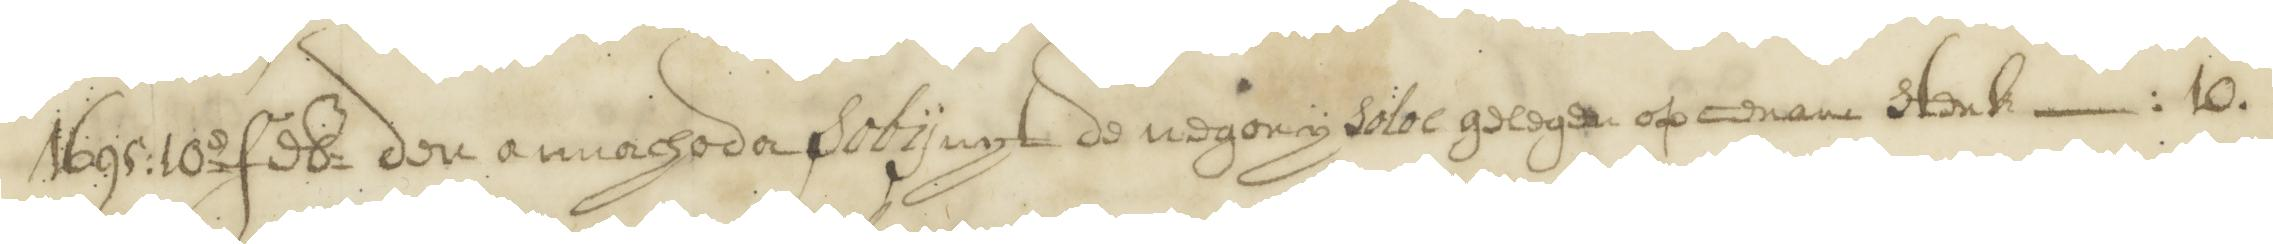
1695: 10=en feb= den annachoda sobij uyt de negorij soloe gelegen op ceram sterk —: 10.
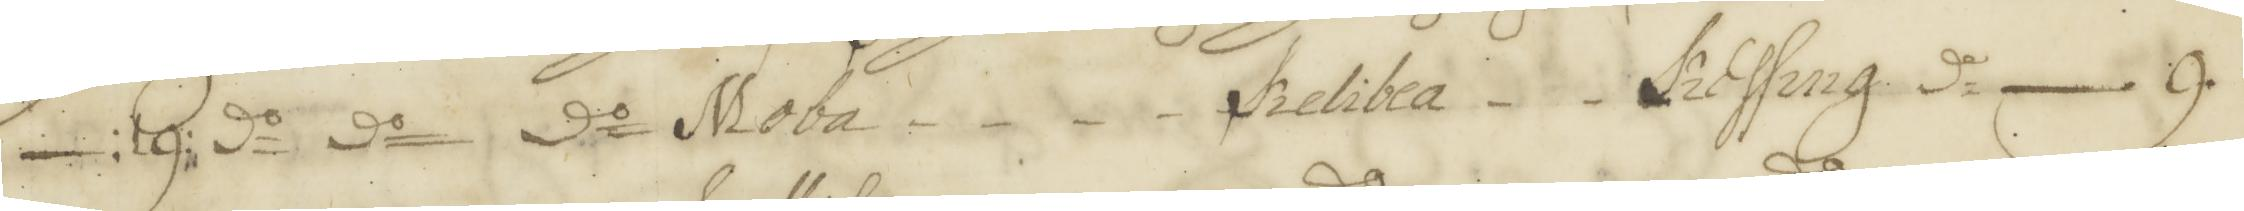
—: 19: _=o _=o _=o Moba - - - - Kelibea - - keffing _=o — 9.
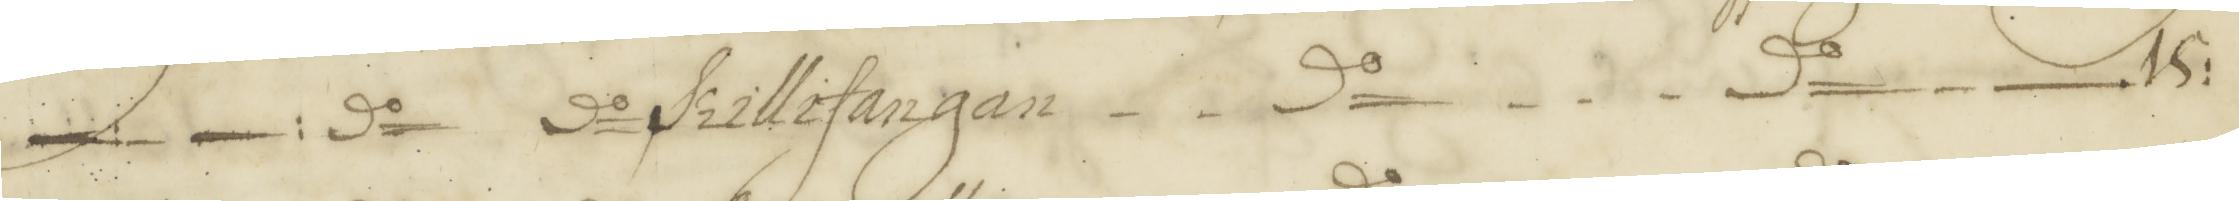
—: —: _=o _=o killifangan - - d=o - - - d=o - —.15:
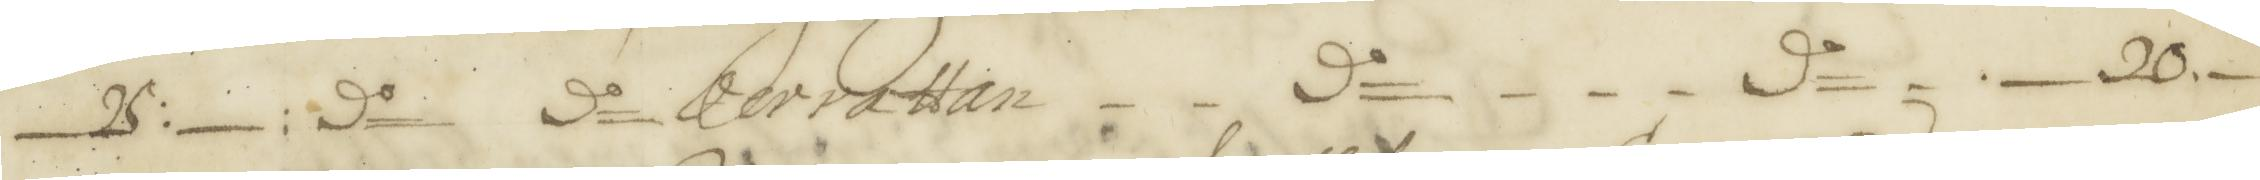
— 25: —: _=o _=o oerrattan _=o _=o - . — 20. —
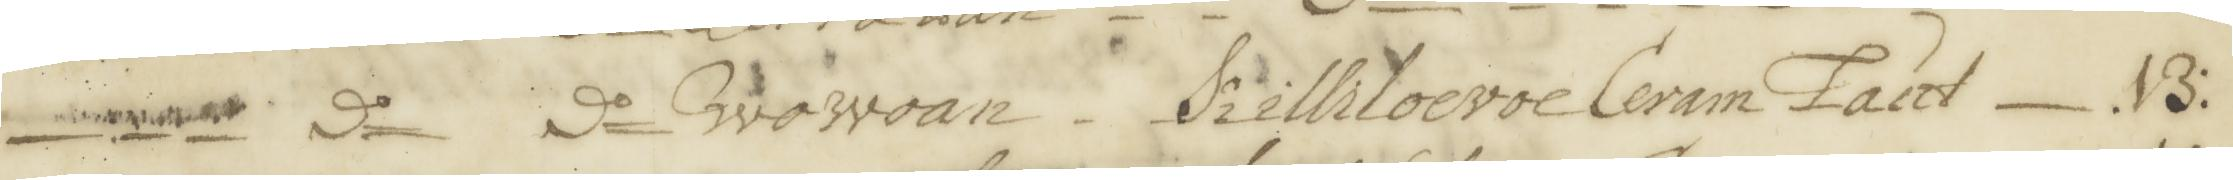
—: — — _=o _=o wowoan - -killiloevoe Ceram Laut —. 13:
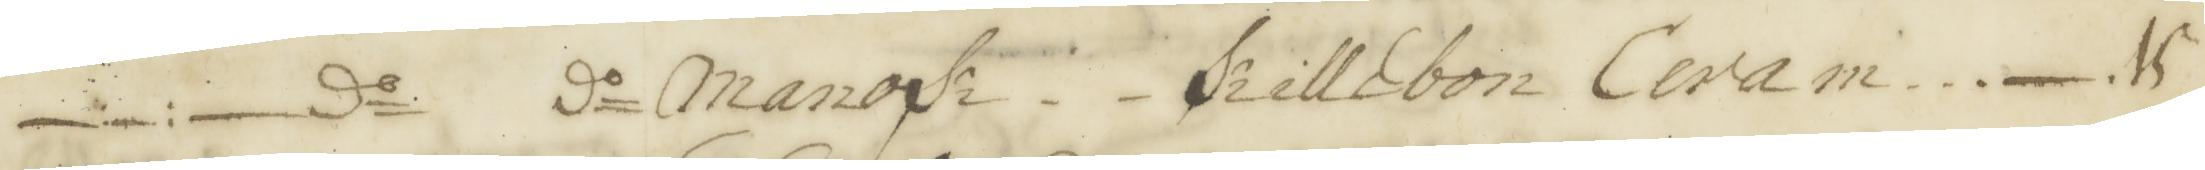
—: —: _=o _=o manok - - killebon Ceram . . . —. 15
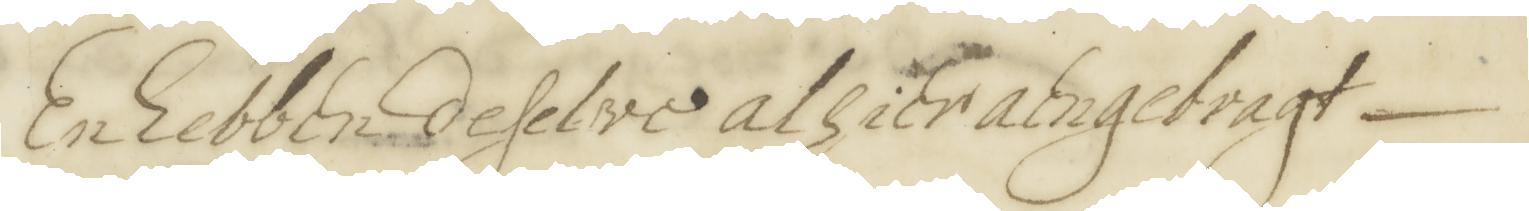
En hebben deselve alhier aengebragt —
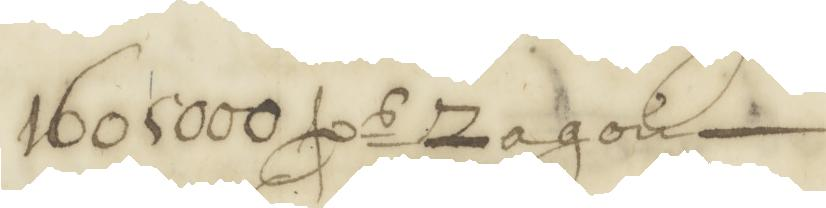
1605000 p=s zagou —
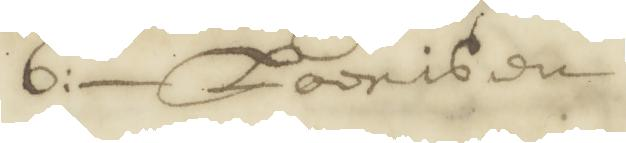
6: — loeris en
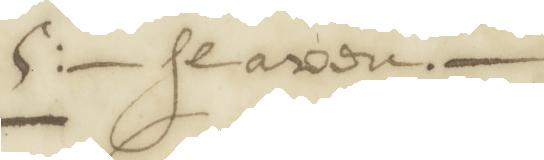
5: — slaven. —
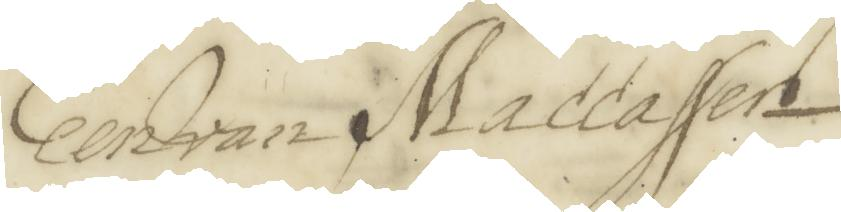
een van Maccassen—
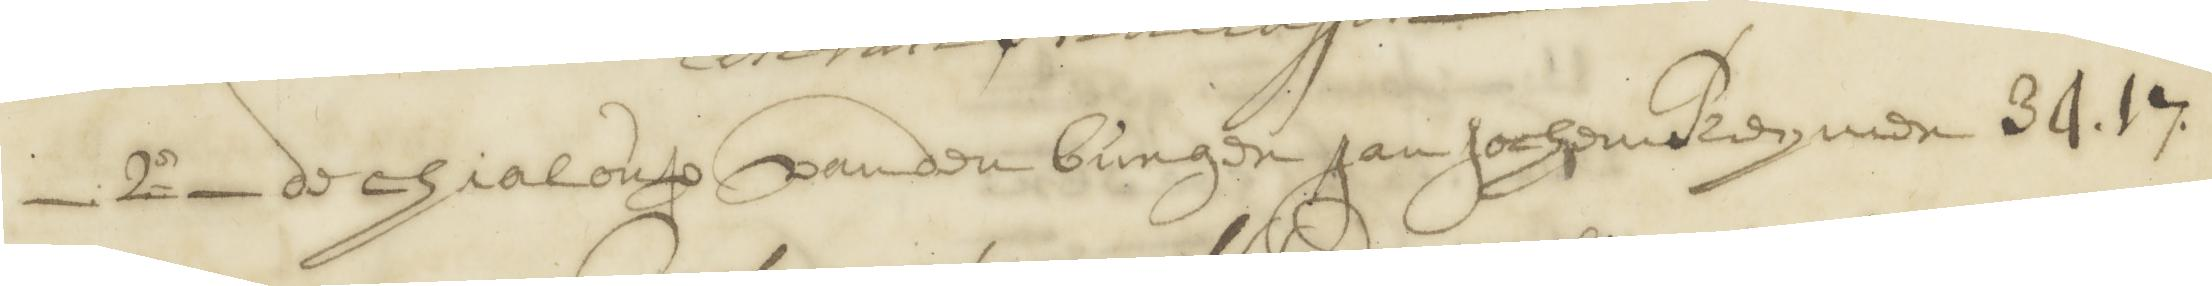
—: 2=en — de chialoup van den burgen jan sochem Preij men 34. 17.
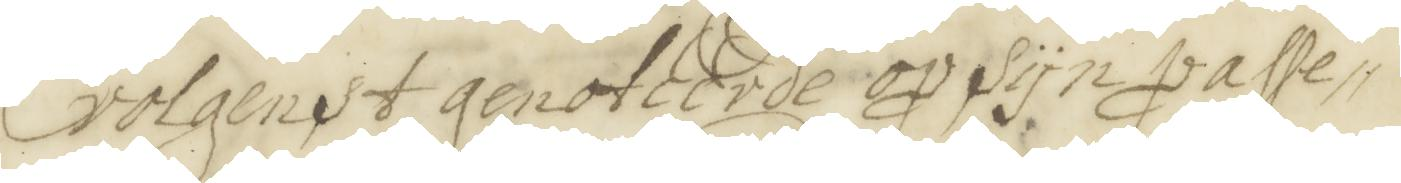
volgens 't genoteerde op sijn passe„
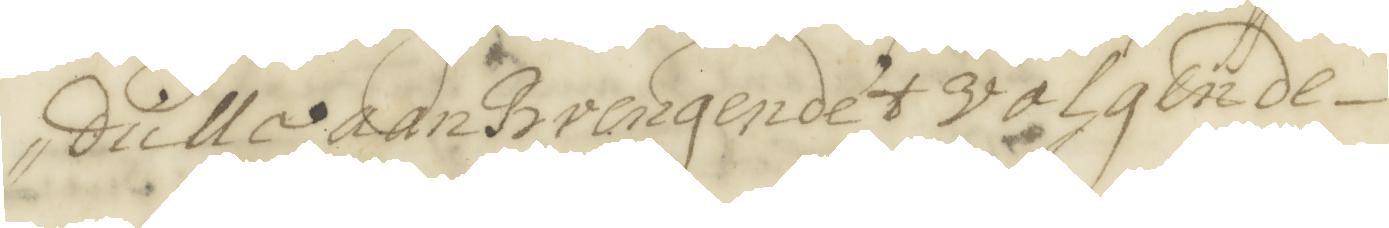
„dulle aan Brengende ’t volgende —
